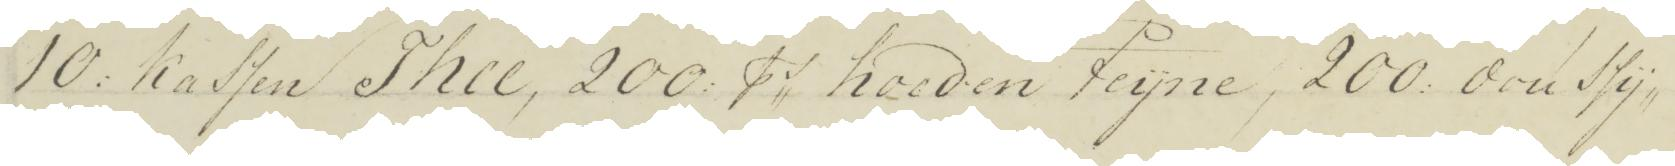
10. kassen Thee, 200: p„s hoeden feijne, 200: doussij„
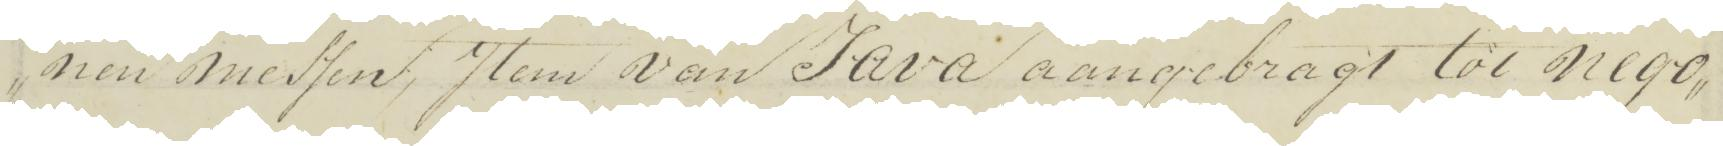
„nen messen, Jtem van Iava aangebragt tot nego„
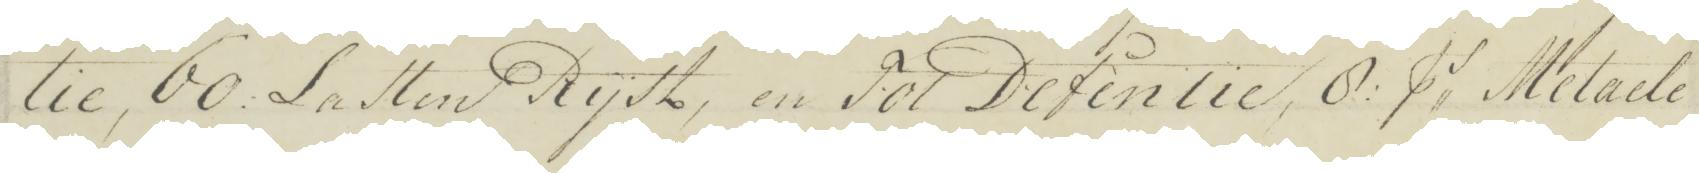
tie, 60: Lasten Rijst, en Tot Defentie, 8: p„s Metaele
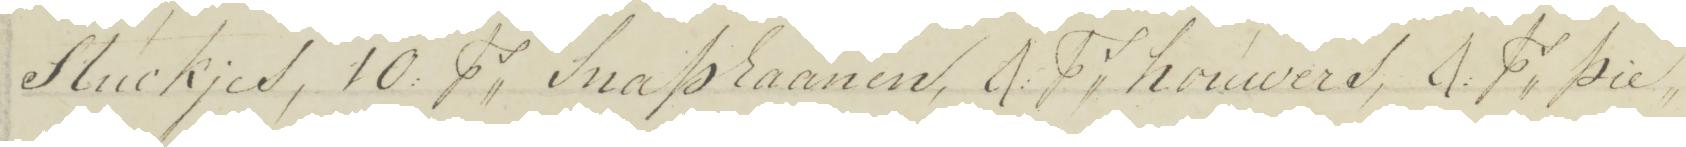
Stuckjes, 10: p„s Snaphaanen, 4: p„s houwers, 4: p„s pie„
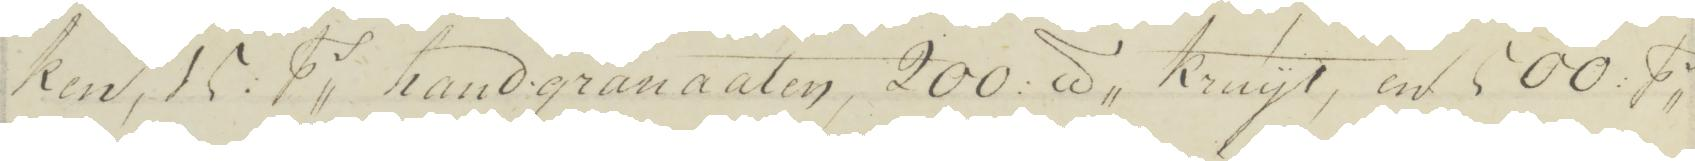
ken, 15: p„s handgranaaten, 200: id„ kruijt, en 500: p„s
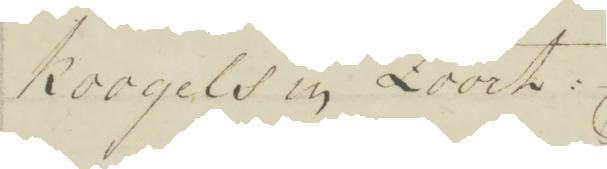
koogels in Zoort:
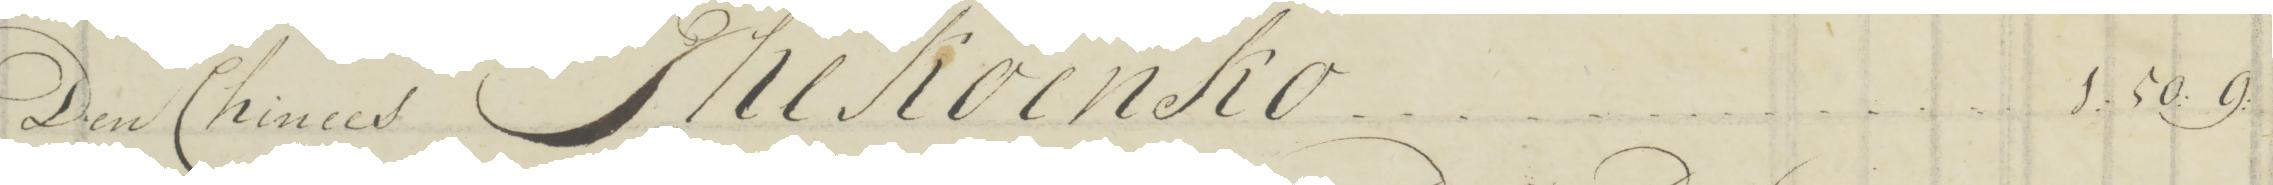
Den Chinees The Koen Ko . . . . . . . . . . . . . .1: 50: 9:
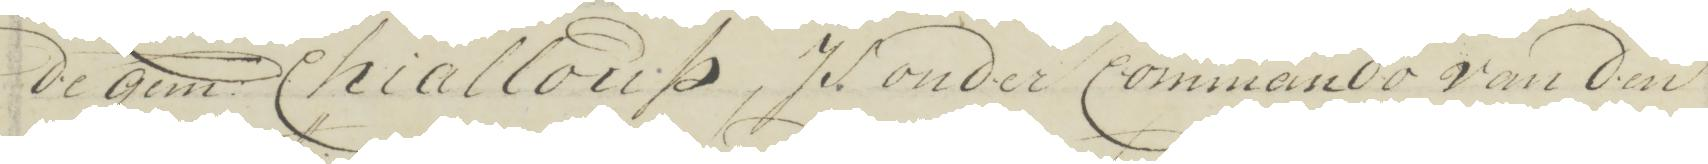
de gem: Chialloup, Js. onder Commando van den
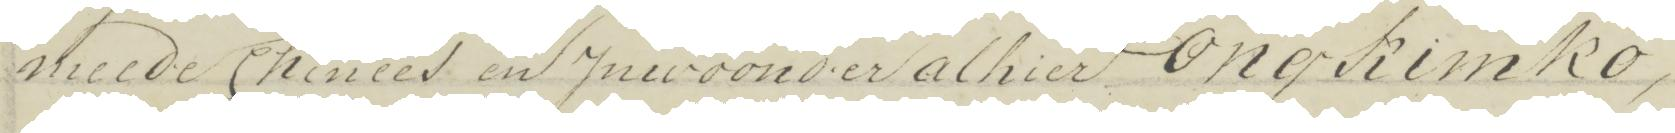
meede Chinees en Jnwoonder alhier Ong Kim Ko,
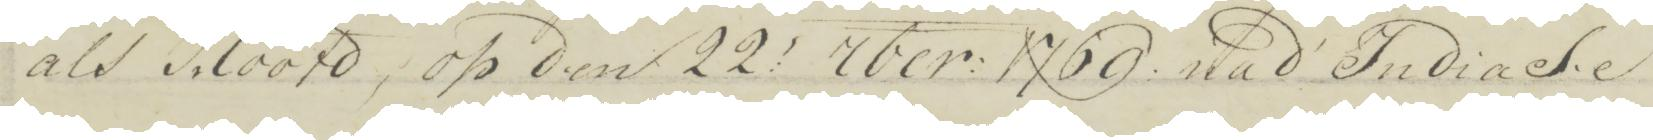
als Hoofd, op den 22:' 7ber: 1769: na d' Indiase
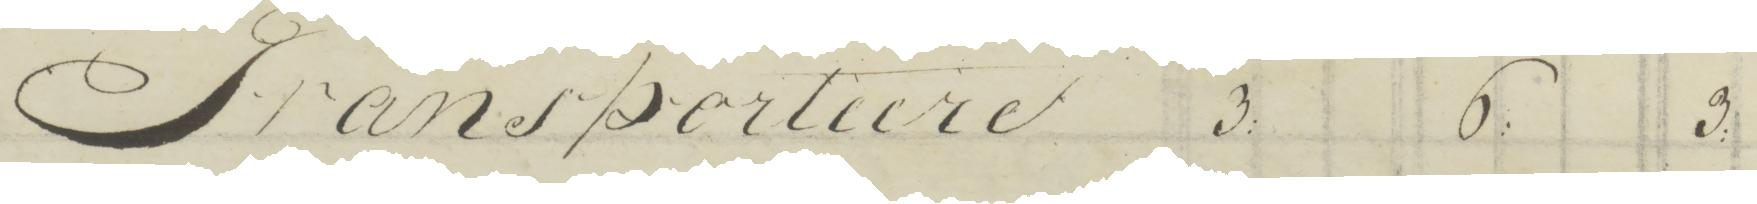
Transportiere 3: 6: 3:
